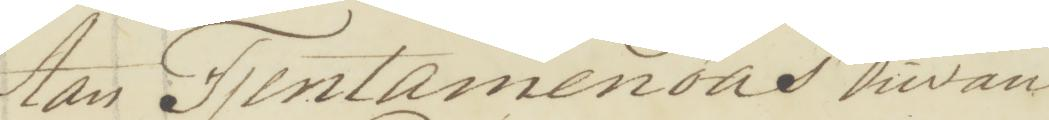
Aan Tjentamendas divan
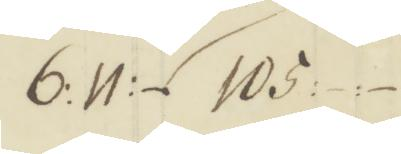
6:11:– 105:–:–
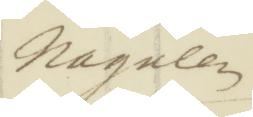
Nagalen
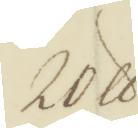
20lb
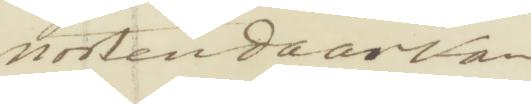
nooten daarvan
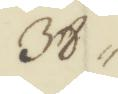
38 „
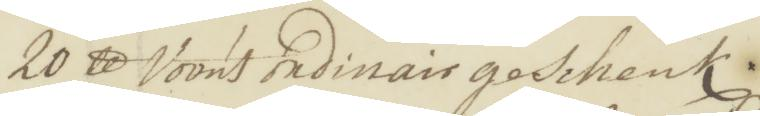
20 lb voor't ordinair geschenk
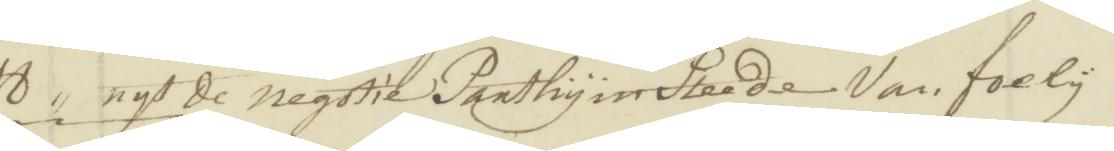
18 „ uyt de negotie Parthij in steede van foelij
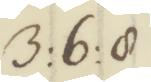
–ƒ 3:6:8
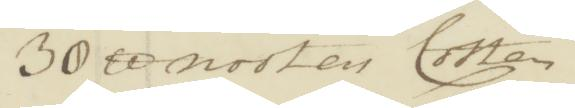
38 lb nooten Costen
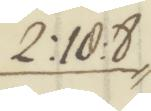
2:10:8
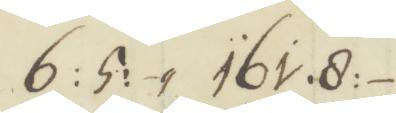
6:5:–„ 161.8:–
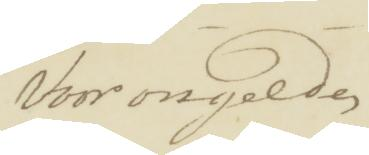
voor ongelden
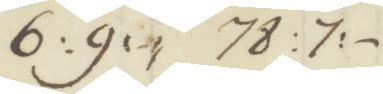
6:9:-„ 78:7:–
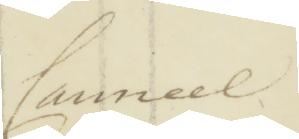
Canneel.
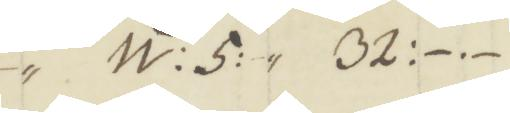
„ 11:5: „ 32:–.–
